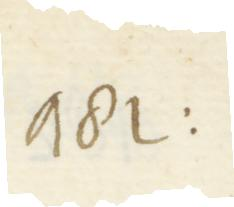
481:
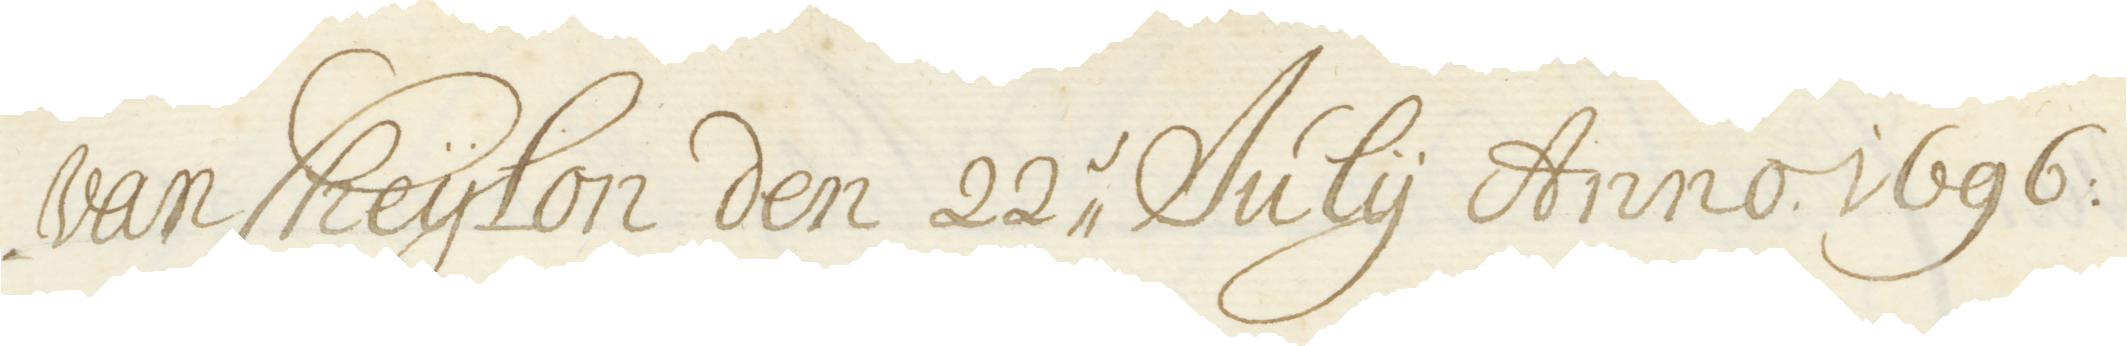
Van Cheijlon den 22„e Iulij Anno 1696:
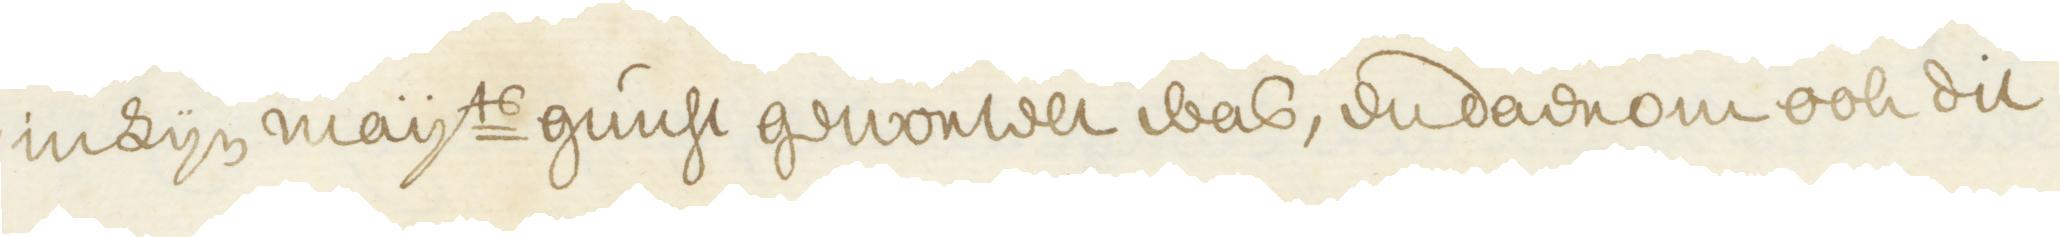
in zijn maij=ts gunst gewortelt was, en daerom ook dit
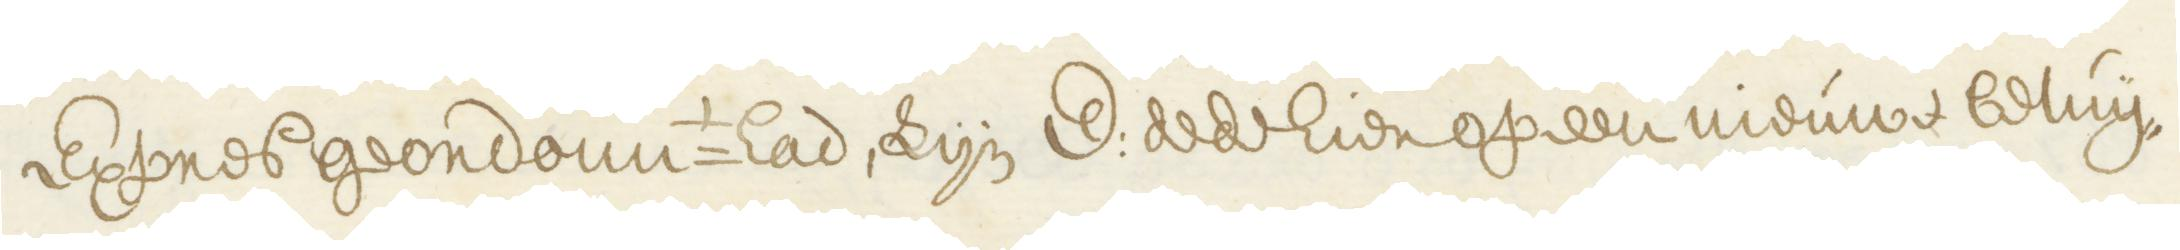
Expres geordonn=t had, zijn E: de de hierop een nieuwe betuij„
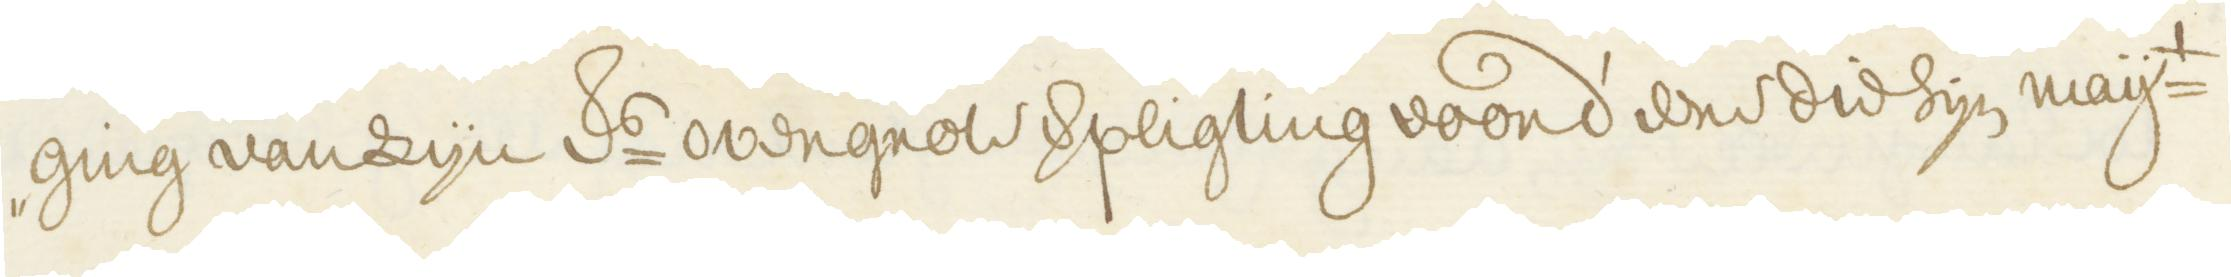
„ging van zijn E=s overgrote verpligting voor d’eere die sijn maij=t
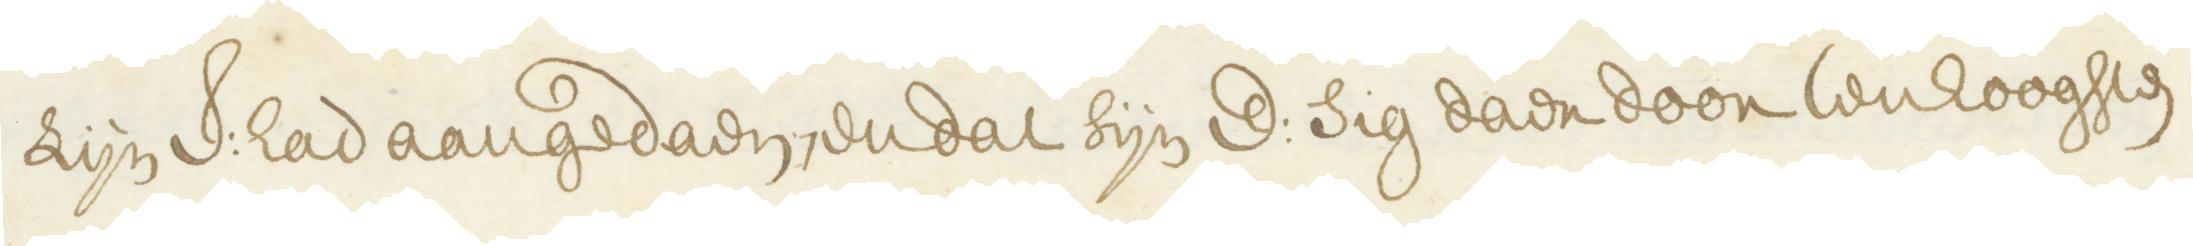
zijn E: had aangedaen, en dat sijn E: sig daer door ten hoogsten
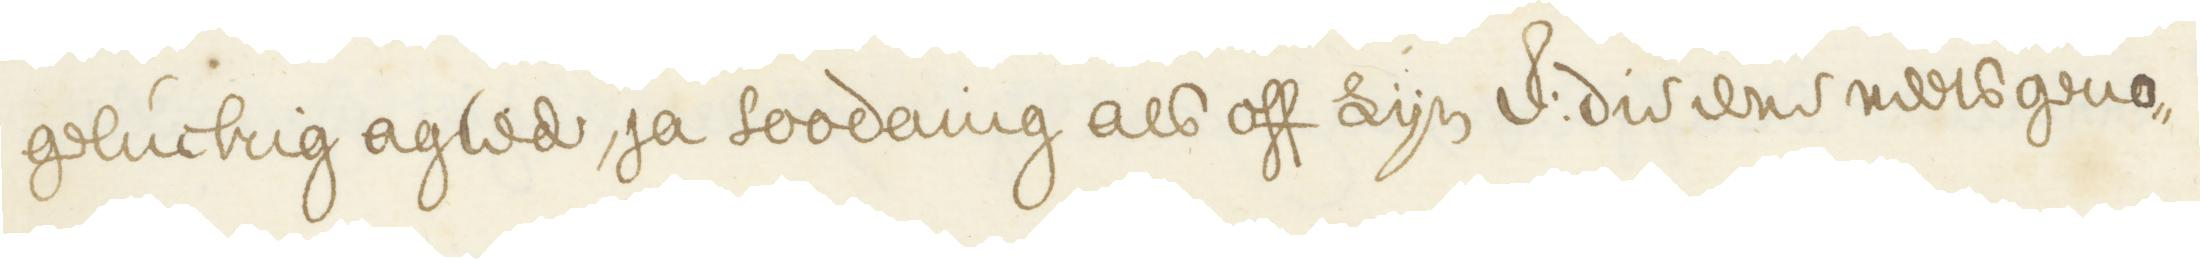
geluckig agtede, ja soodanig als off zijn E: die ere reets geno„
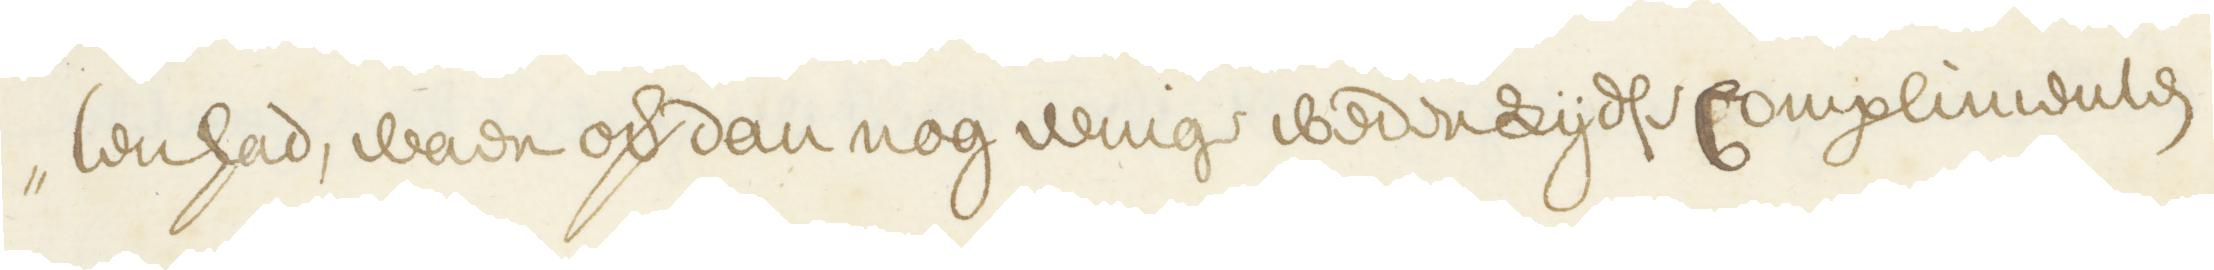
„ten had, waer over dan nog eenige wederzijdse complimenten
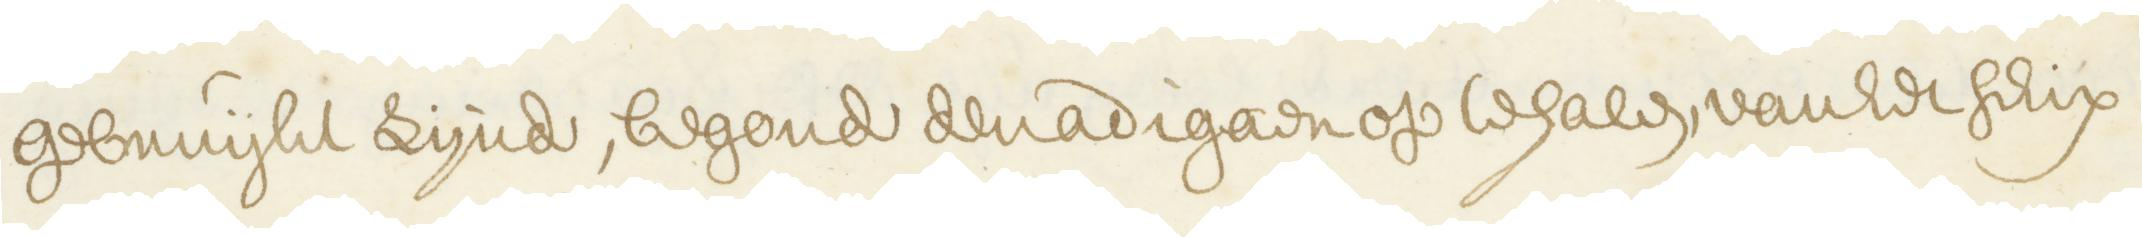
gebruijkt zijnde, begon de denadigaer op tehalen, van het schip
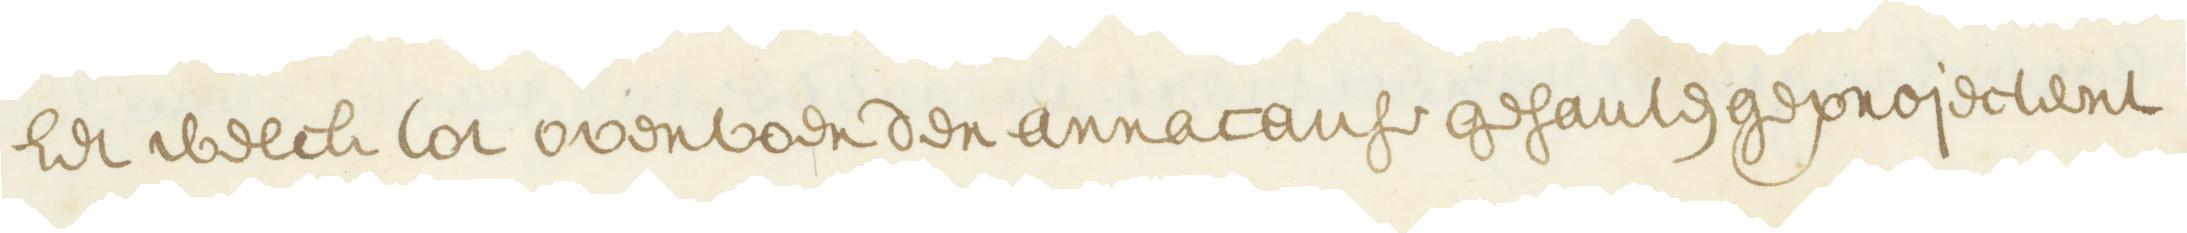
het welck tot overvoer der arracanse gesanten geprojectert
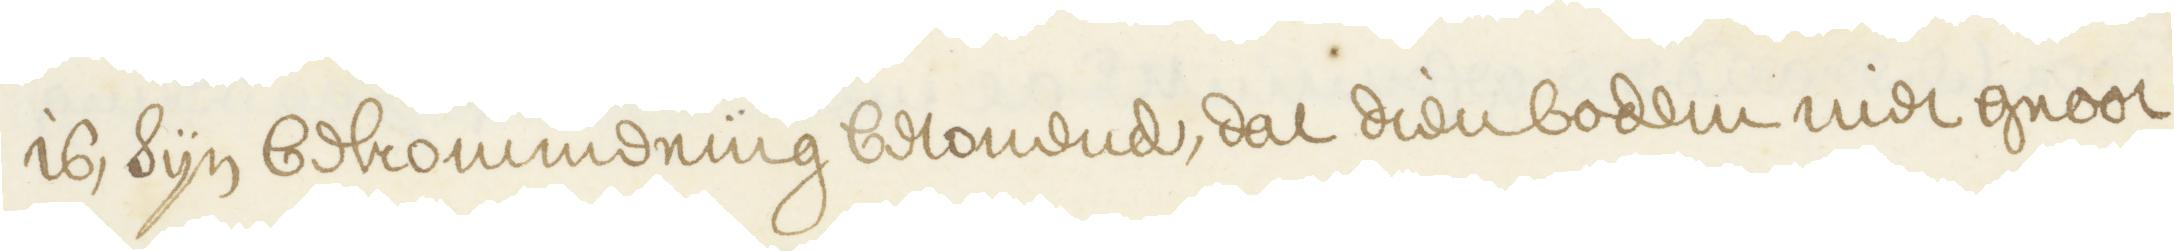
is, sijn bekommering betonende, dat dien bodem niet groot
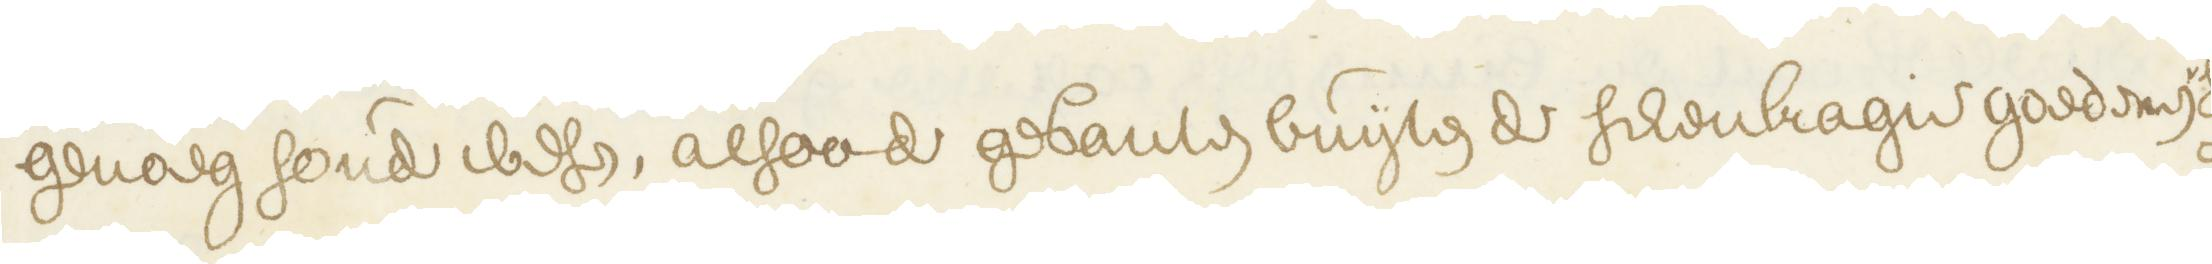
genoeg soude wesen, alsoo de gesanten buijten de schenkagie goederen
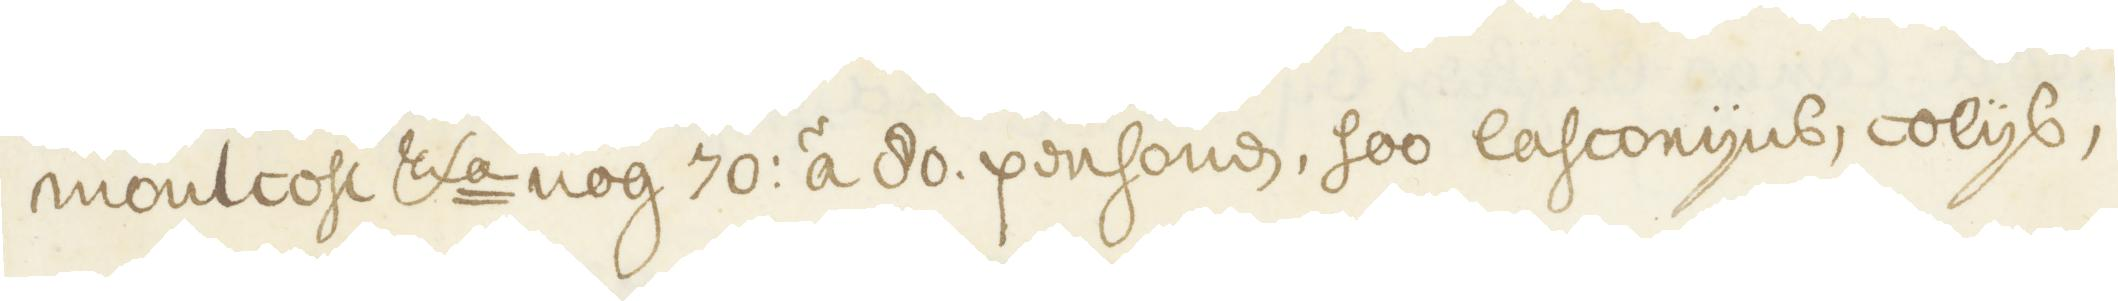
montcost Et=a nog 70: â 80. personen, soo lascorijns, colijs,
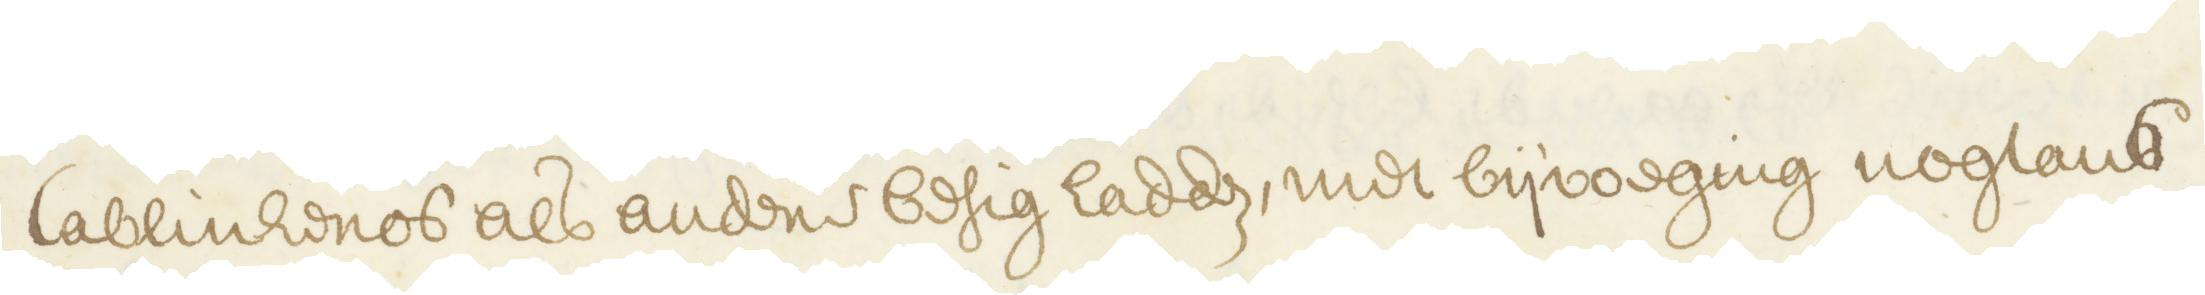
tablinheros als andere besig hadden, met bijvoeging nogtans
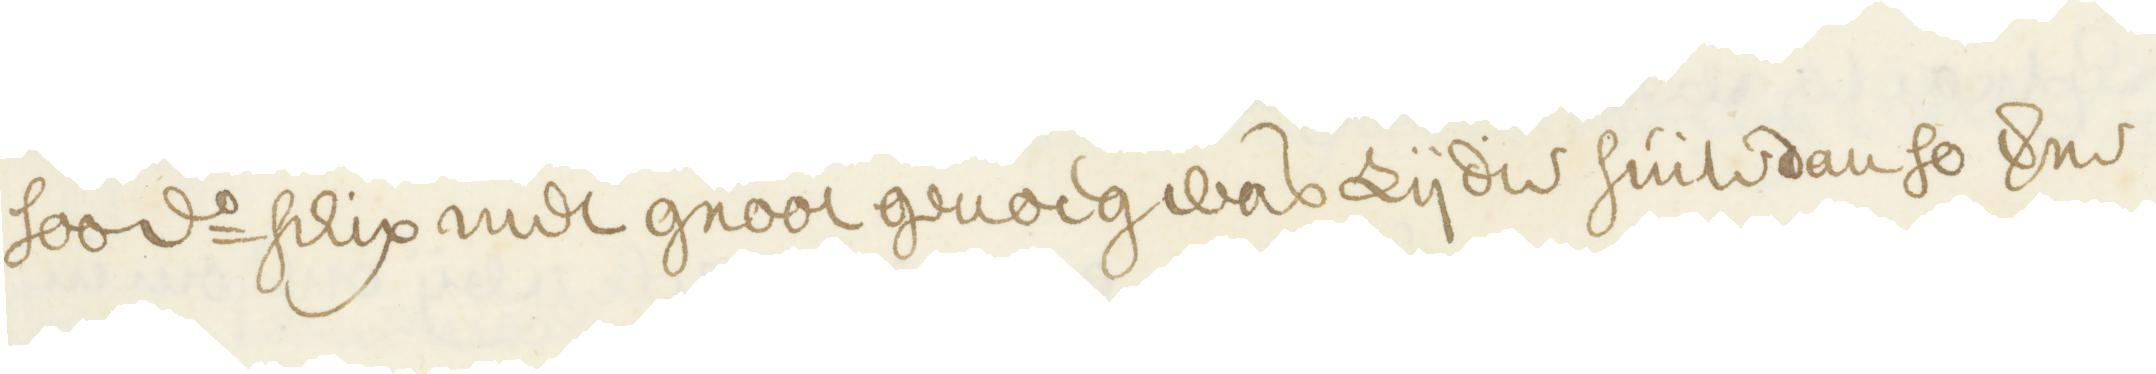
soo d=o schip niet groot genoeg was zij die suite dan so verre
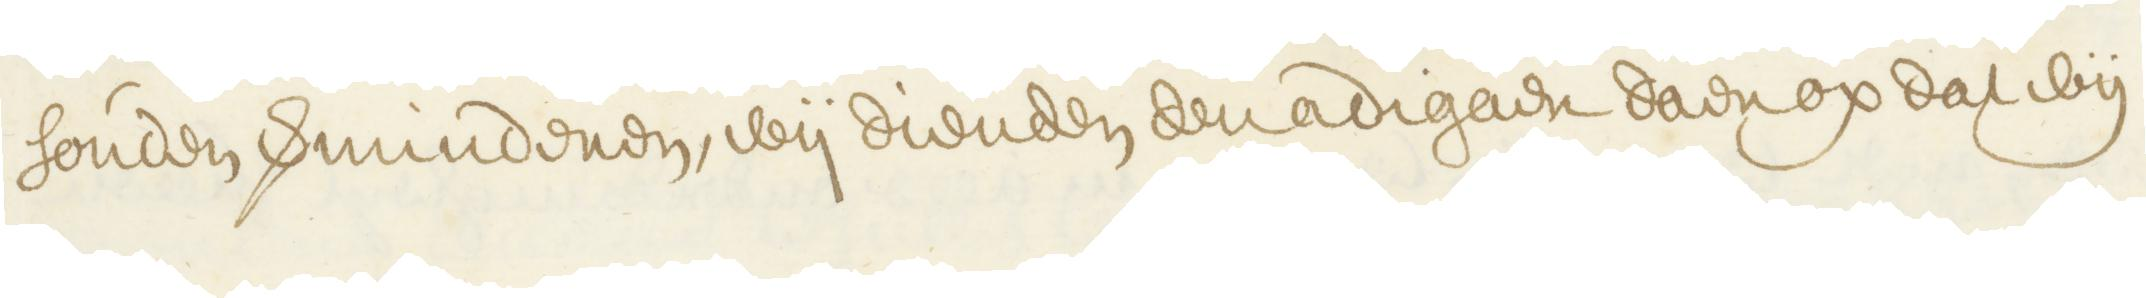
souden verminderen, wij dienden den adigaer daer op dat wij
